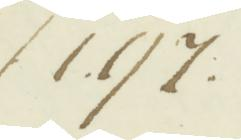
ƒ1.97.
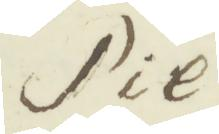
Pie
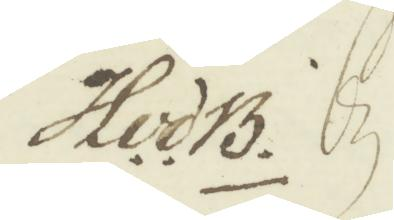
HvdB
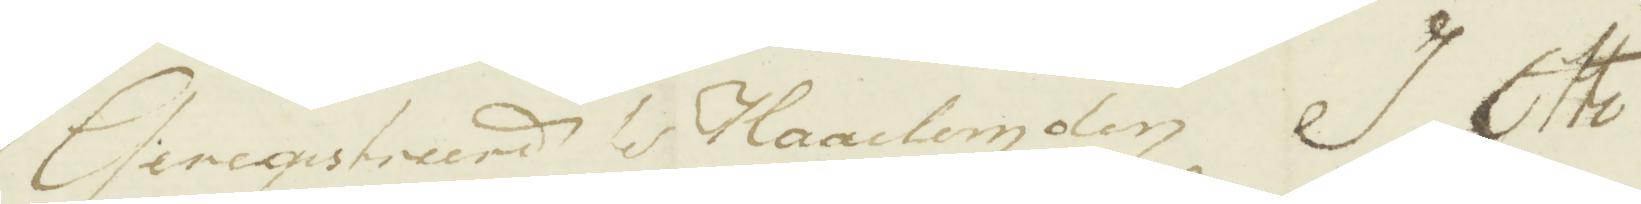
Geregistreerd te Haarlem den J Otto
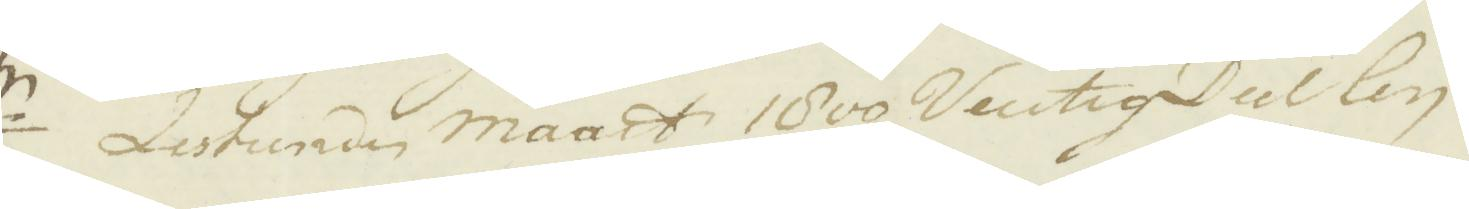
Zestienden maart 1800 Veertig Deel Een
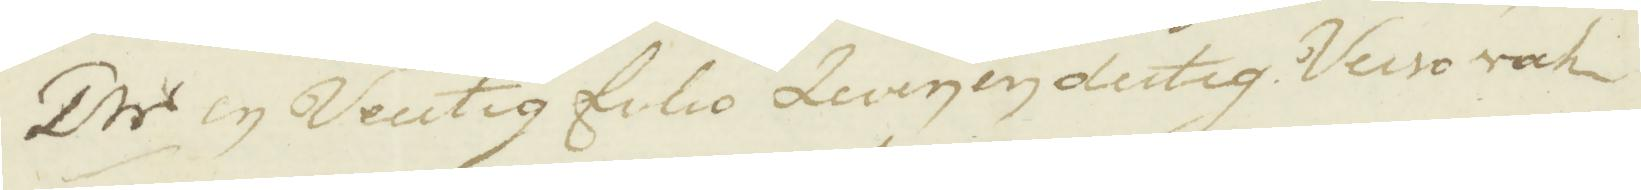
Dw en Veertig folio Zeven en dertig Verso vak
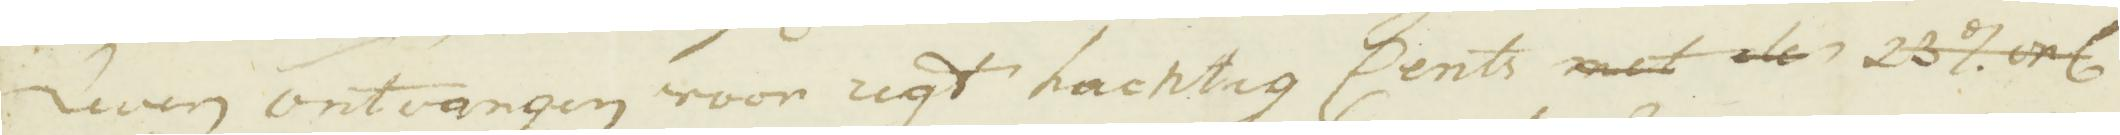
Zeven ontvangen voor regt tachtig Cents met de 23% opC
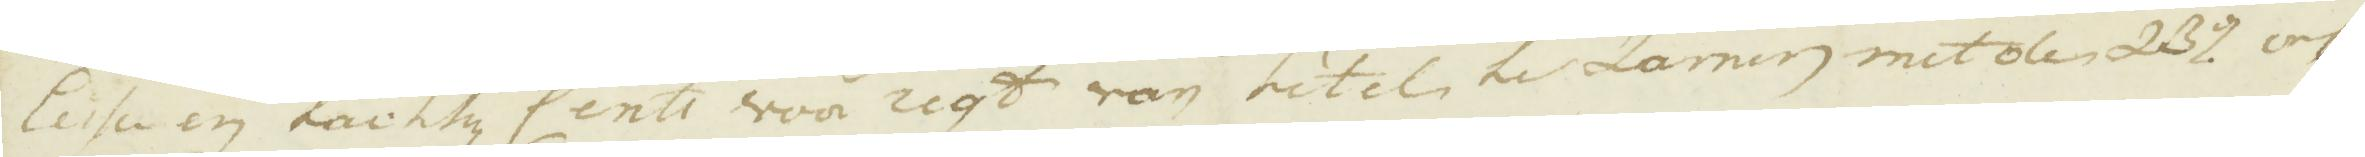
Eenen en tachtig Cents voor regt van titel te zamen met den 23% opC
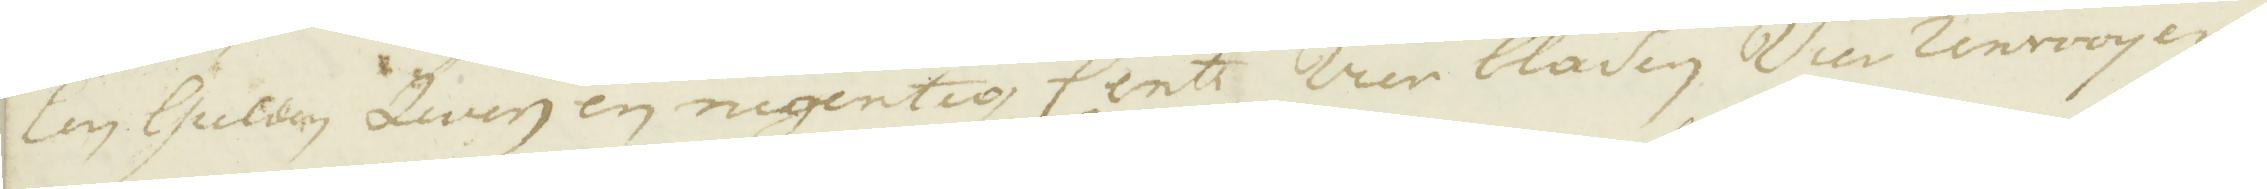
Een Gulden Zeven en negentig Cents vier bladen Vier renvooyen
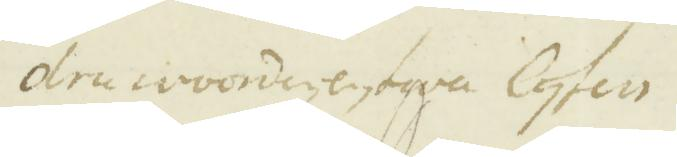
drie woorden en twee Cyfers
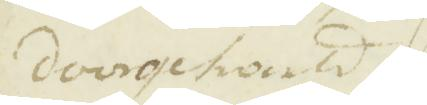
doorgehaald
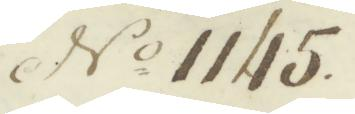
N=o 1145.
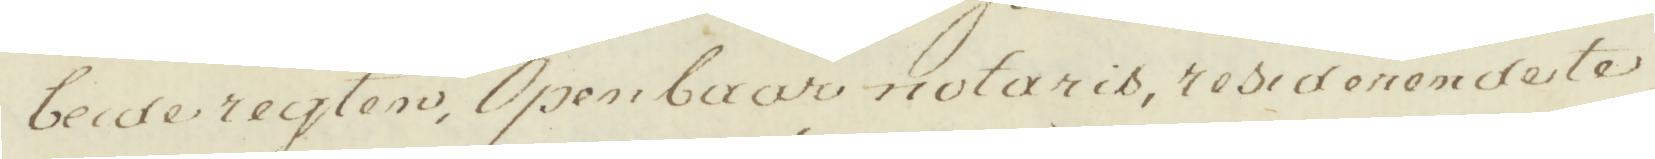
beide regten, Openbaar notaris, residerende te
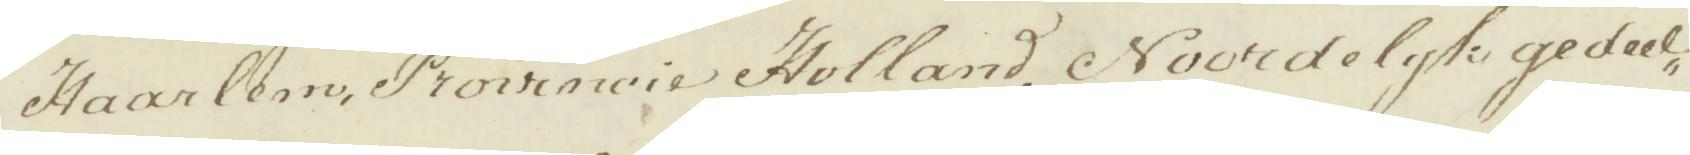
Haarlem, Provincie Holland, Noordelyk gedeel„
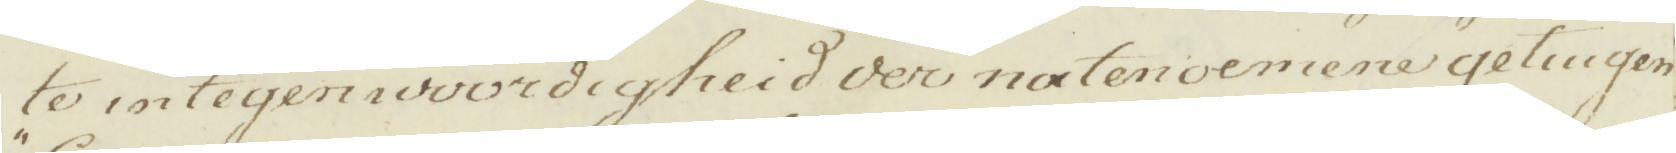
te integenwoordigheid der natenoemene getuigen
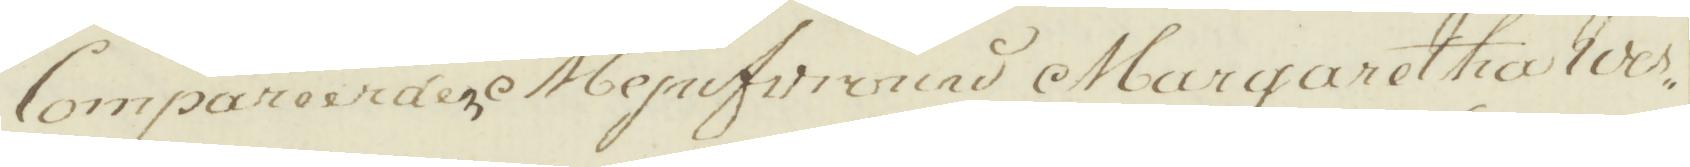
Compareerden Mejufvrouw Margaretha Urs„
